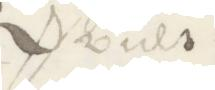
vervult
